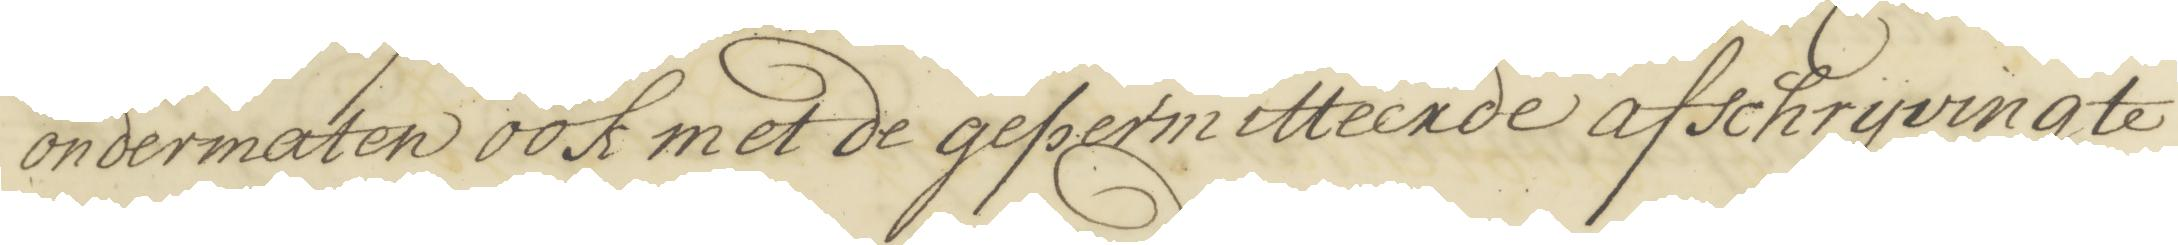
ondermaten ook met de gepermitteerde afschrijving te
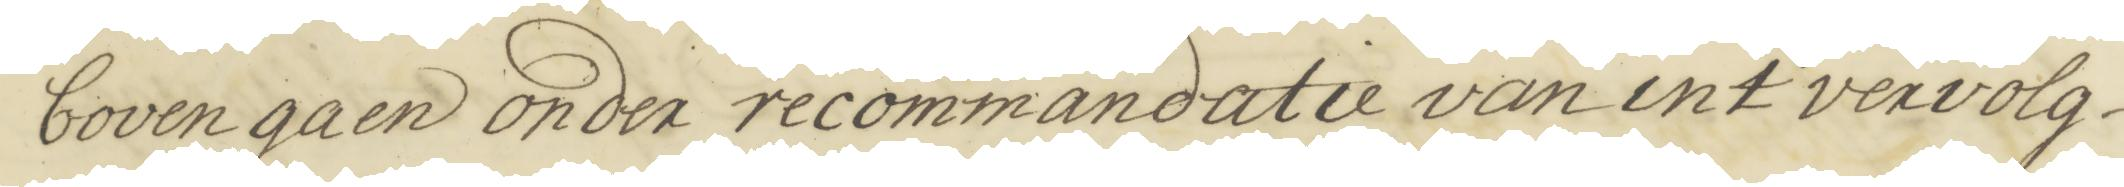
boven gaen onder recommandatie van in’t vervolg-
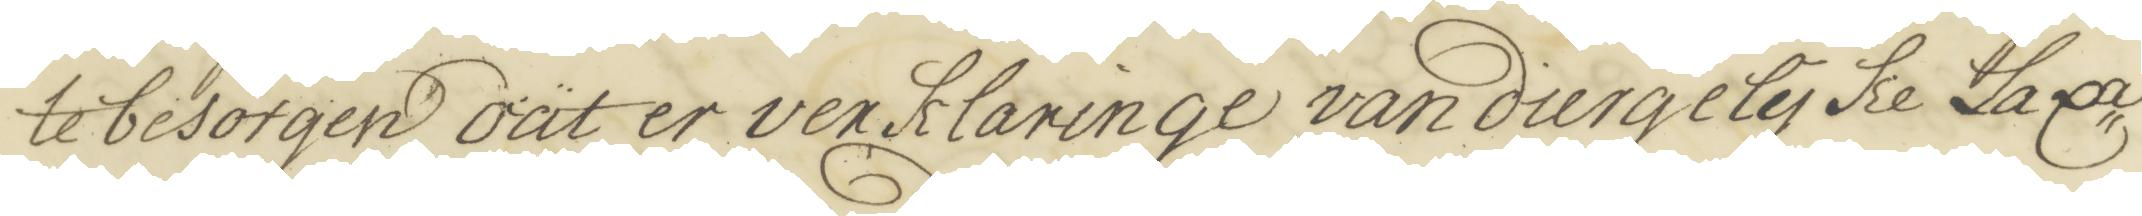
te besorgen dat er verklaringe van diergelijke sapa„
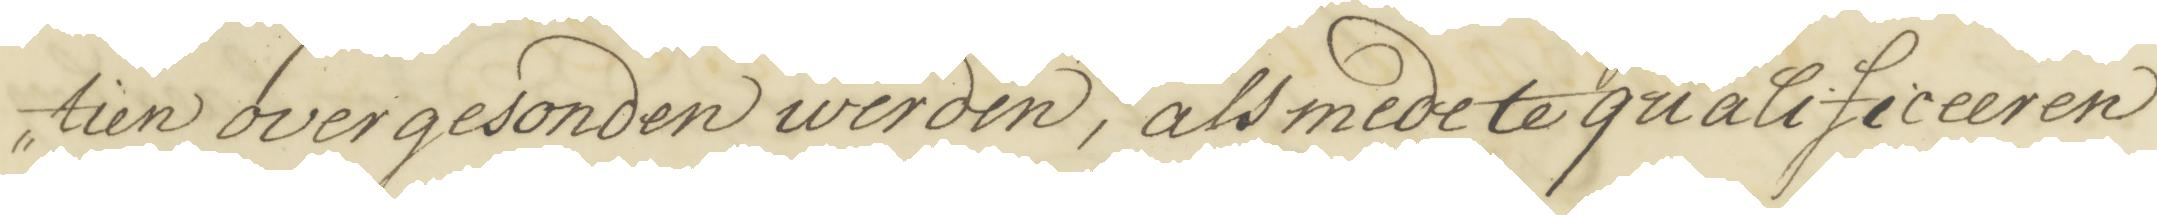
tien overgesonden werden, als mede te qualificeeren
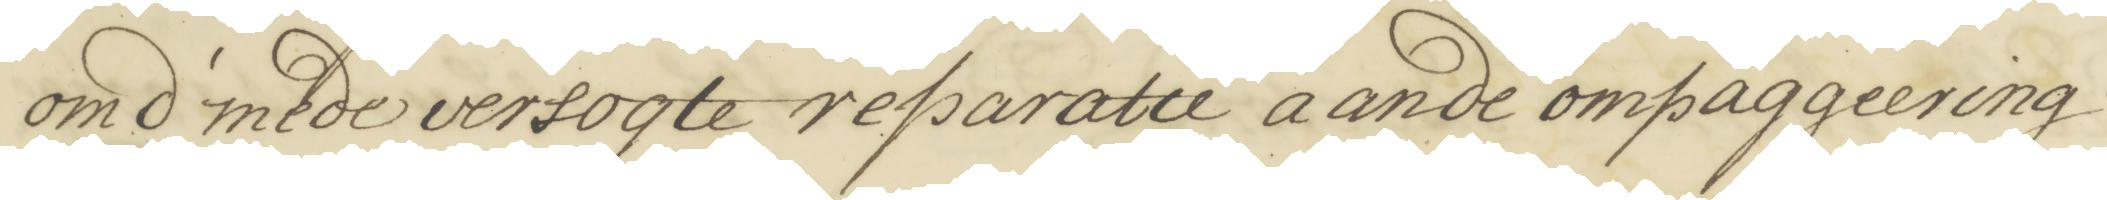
om d’mede versogte reparatie aande ompaggeering
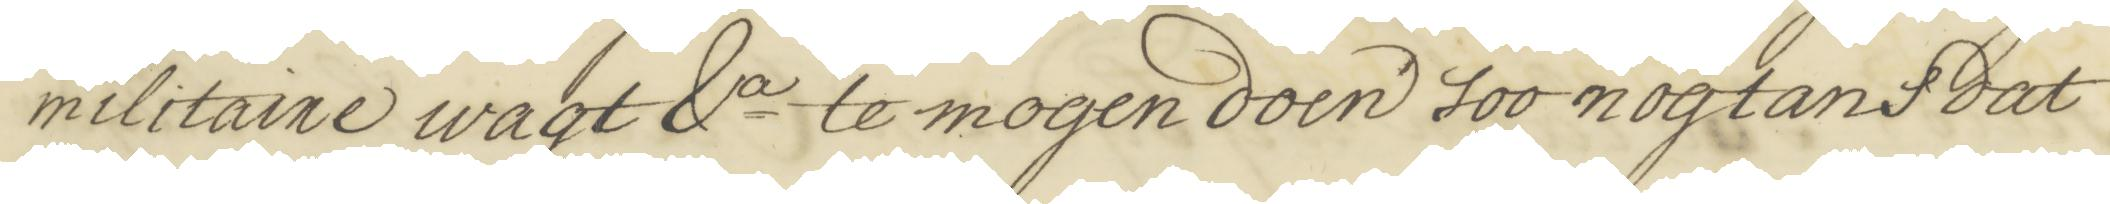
militaire wagt &=a te mogen doen soo nogtans dat
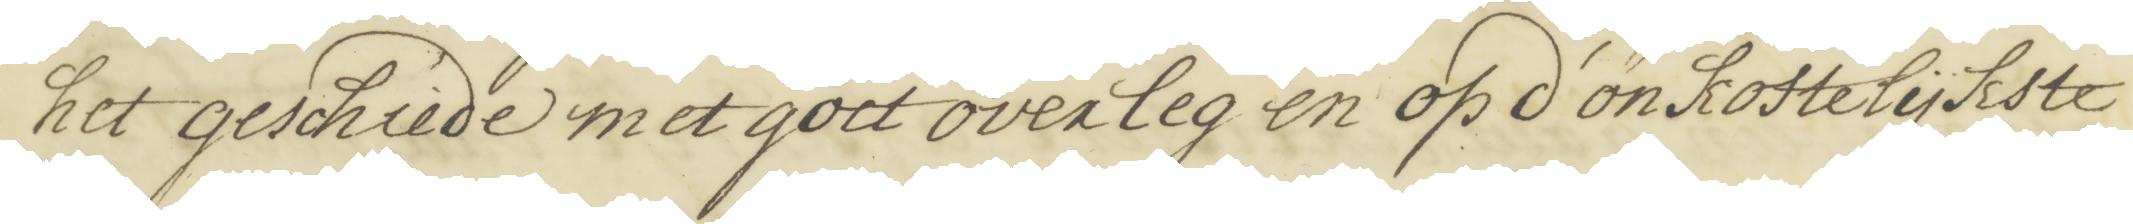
het geschiede met goet overleg en op d’onkostelijkste
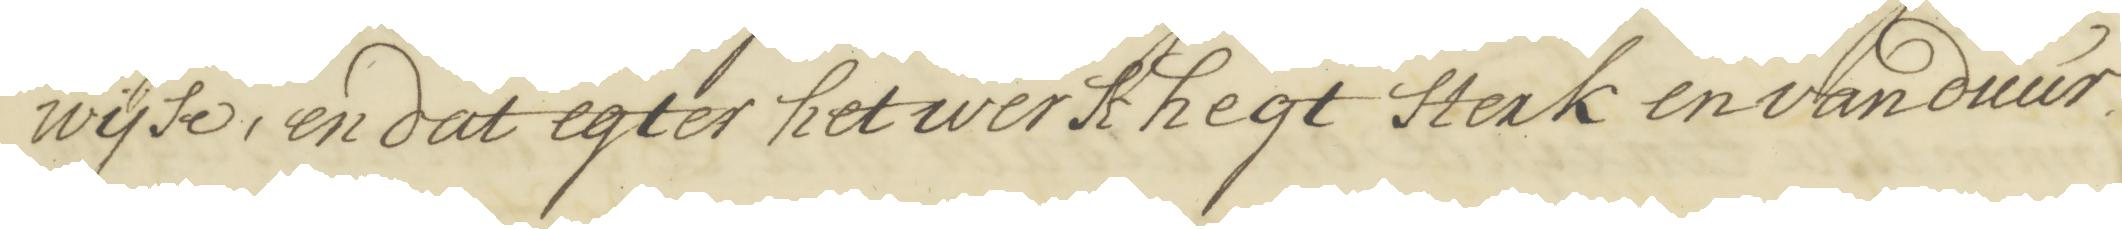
wijse, en dat egter het werk hegt sterk en van duur.
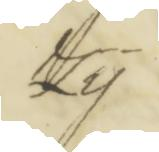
zij. —
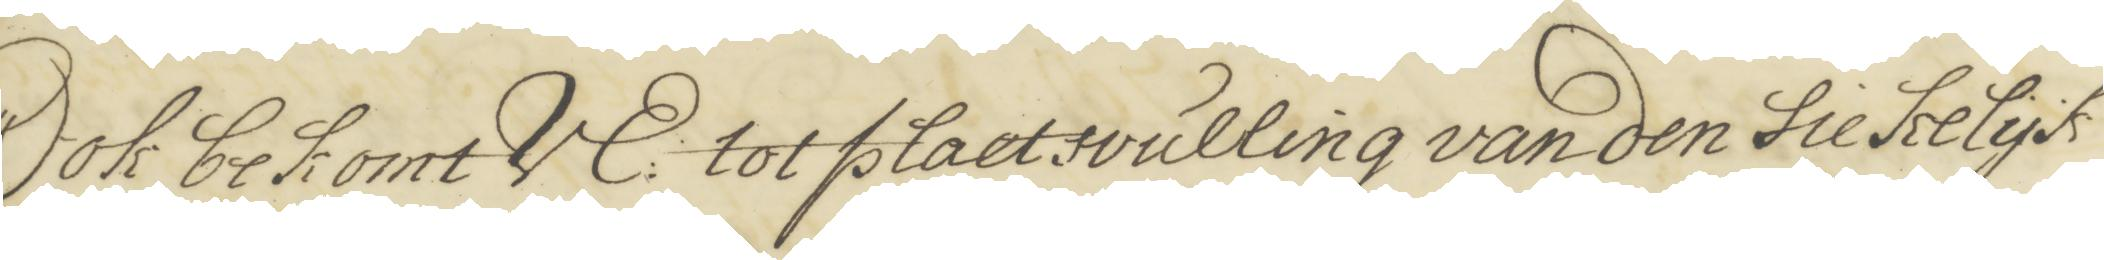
Ook bekomt VE: tot plaetsvulling van den siekelijk
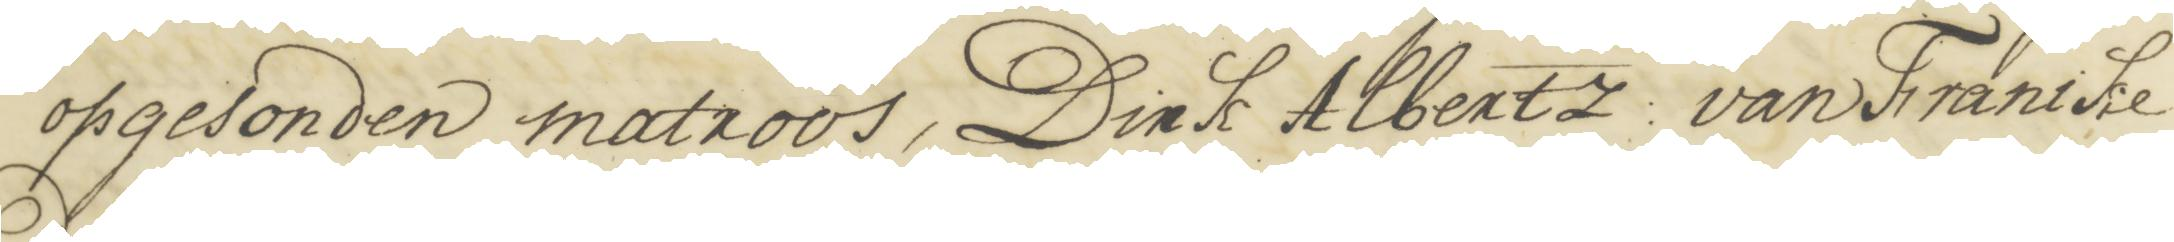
opgesonden matroos, Dirk Albertz: van Franike
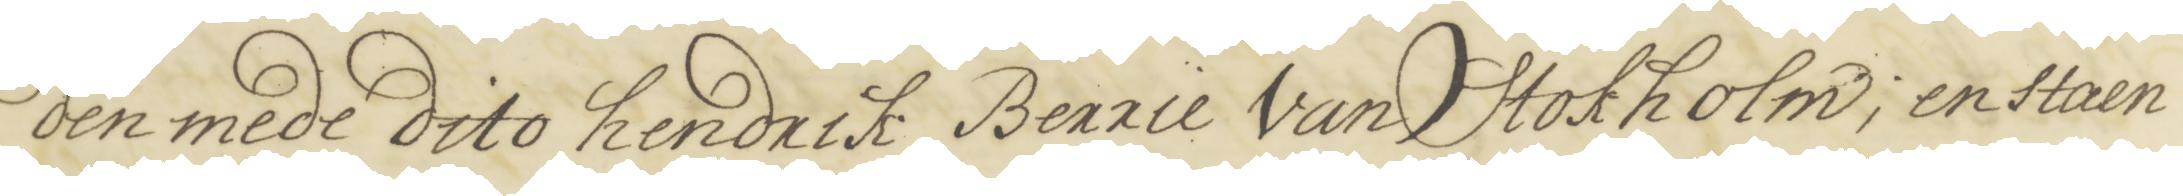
den mede dito hendrik Berrie van Stokholm; en staen
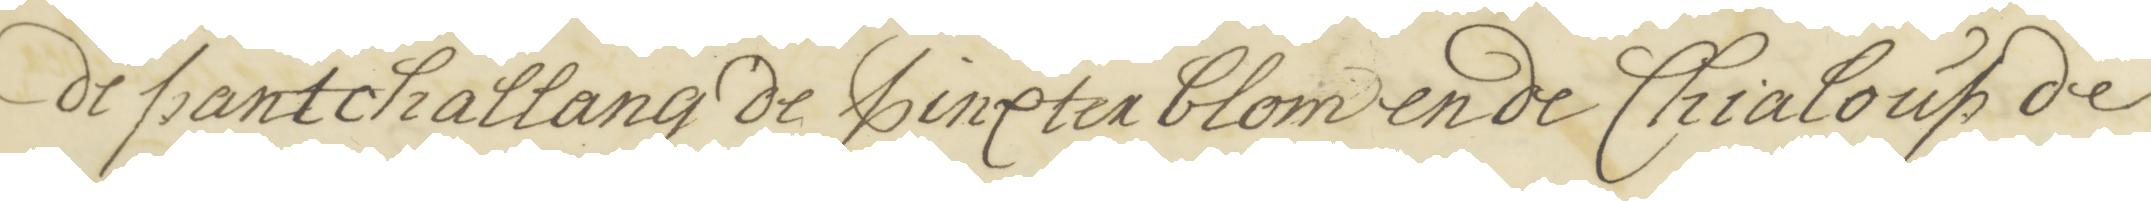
de pantchallang de pinxterblom en de Chialoup de
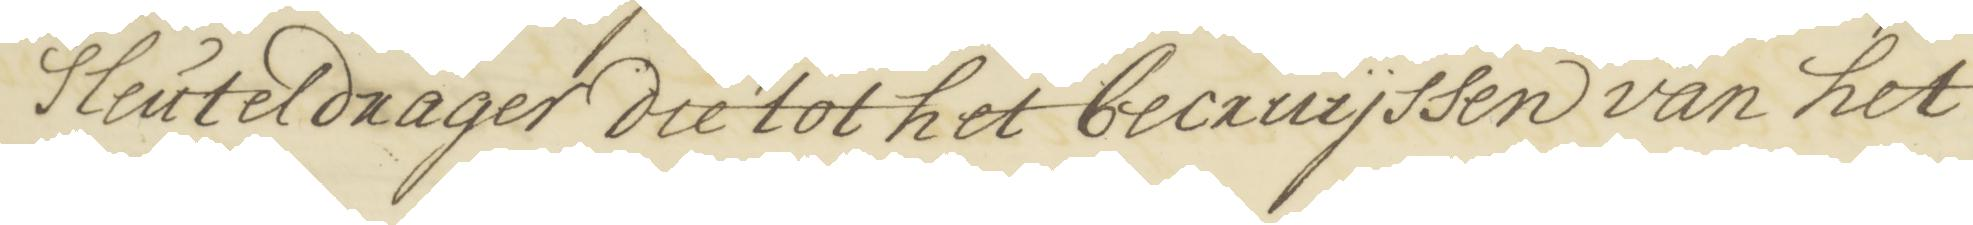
sleuteldrager die tot het becruijssen van het
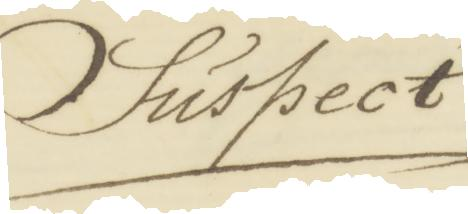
Suspect
